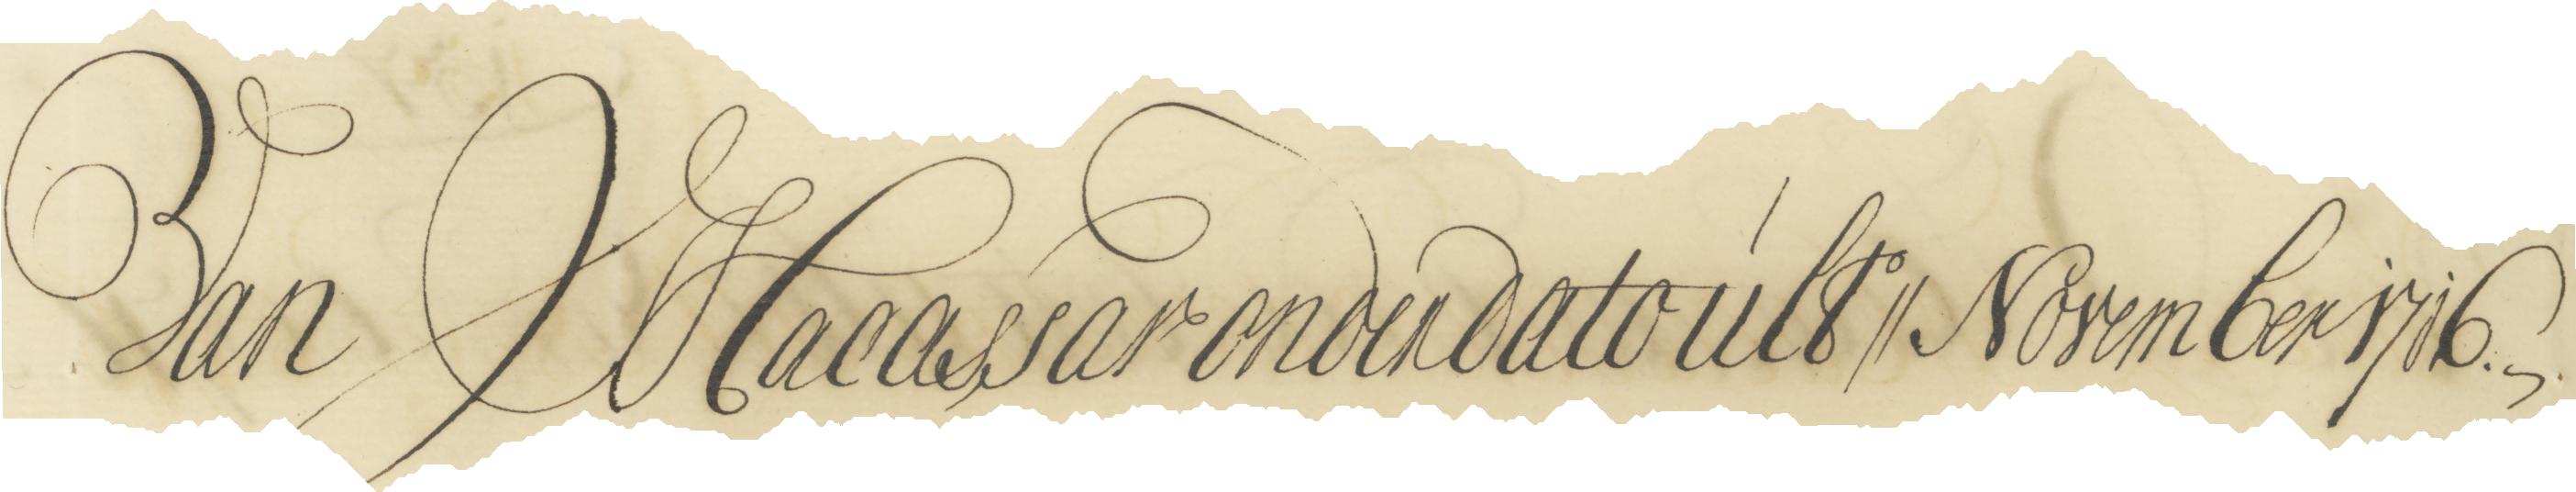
Van Macassar onder dato ult„o November 1716.—
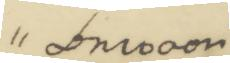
„tenwoon
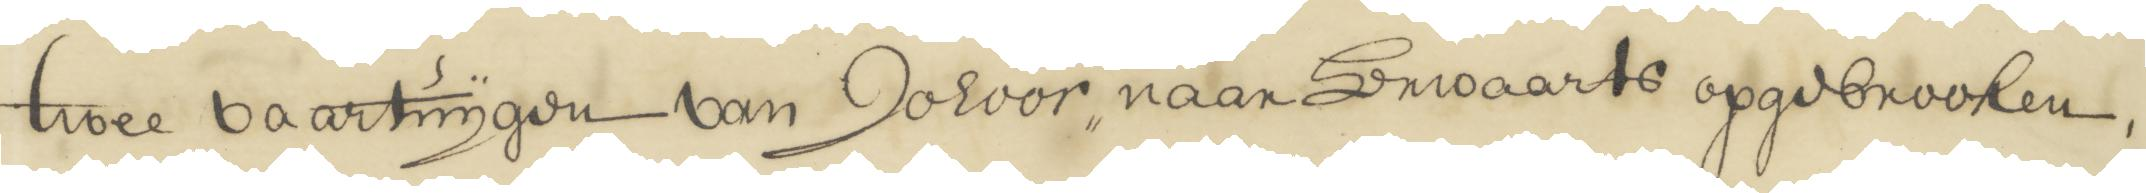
twee vaartuijgen van Johoor„ naar herwaarts opgebrooken,
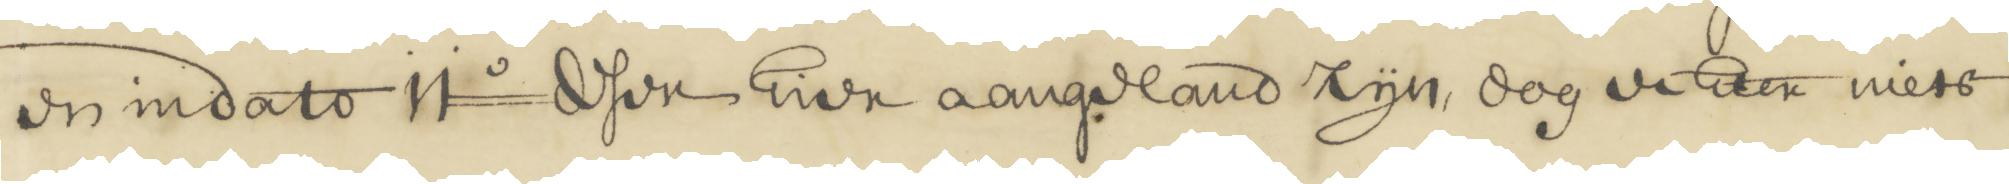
en in dato 11=e deser hier aangeland zijn, dog echter niets
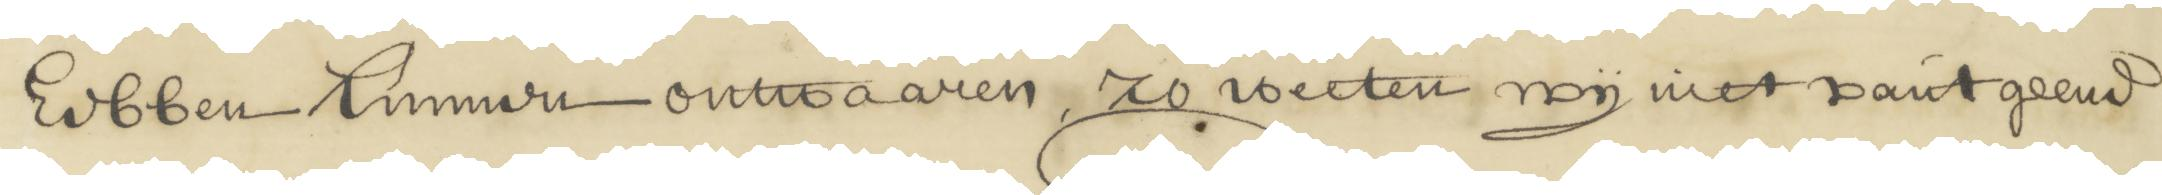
hebben kunnen ontwaaren, zo weeten wij niet van’t geene
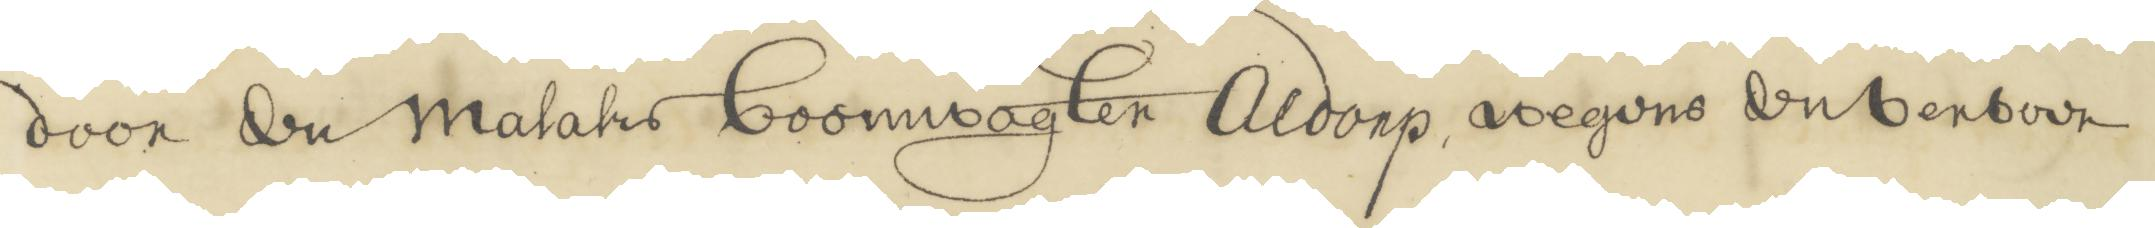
door den malaks boomwagter Aldorp, wegens den vervoer
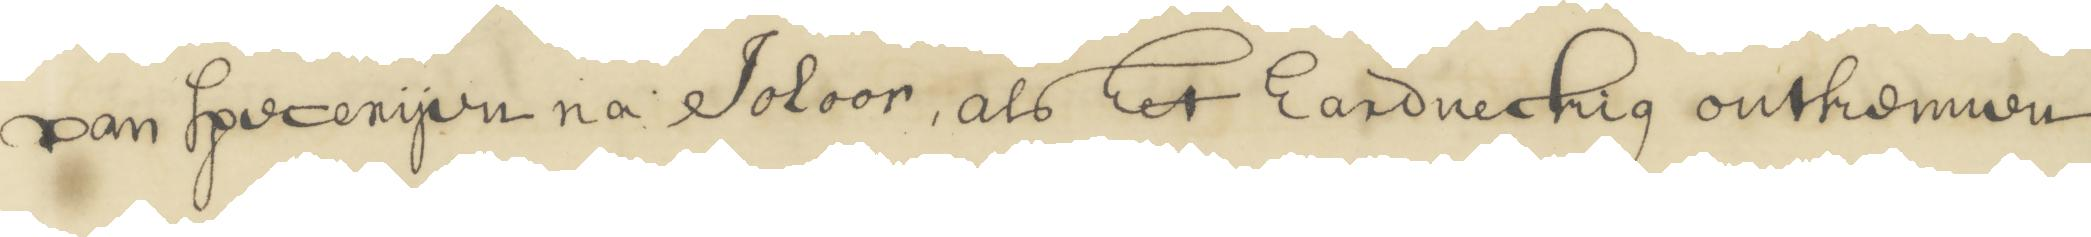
van specerijen na Iohoor, als het hardneckig ontkennen
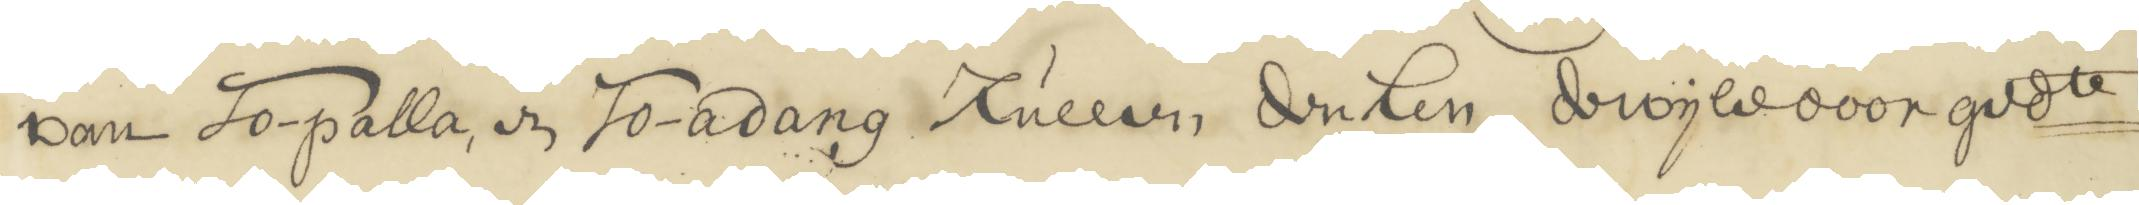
van To-palla, en To-adang zullen denken, dewijle door ged=te
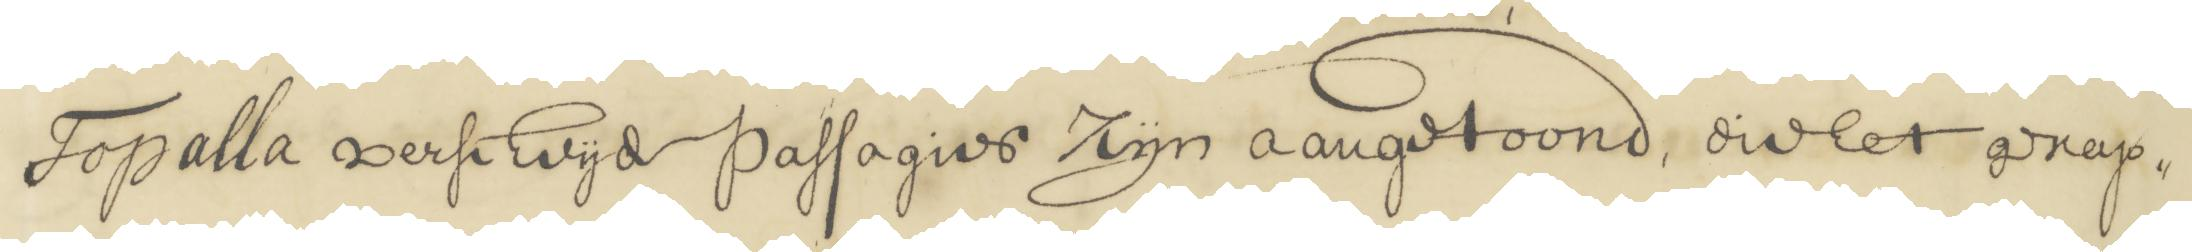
Topalla verscheijde passagies zijn aangetoond, die het gerap„
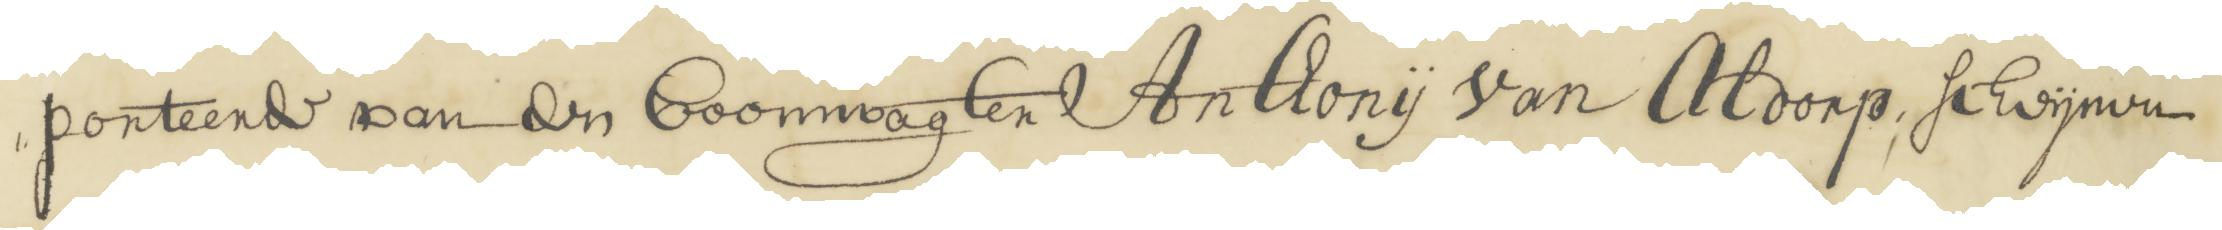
„porteerde van den boomwagter Anthonij van Aldorp, scheijnen
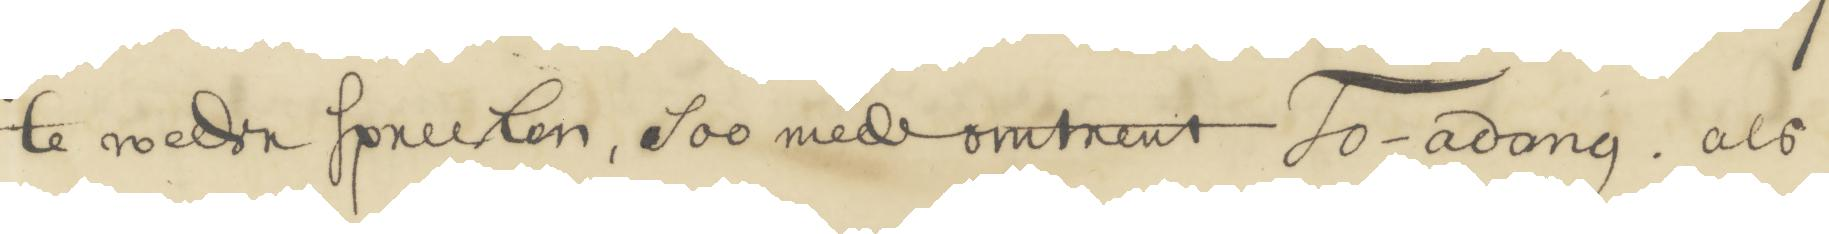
te weder spreeken, soo mede omtrent To-adang. als
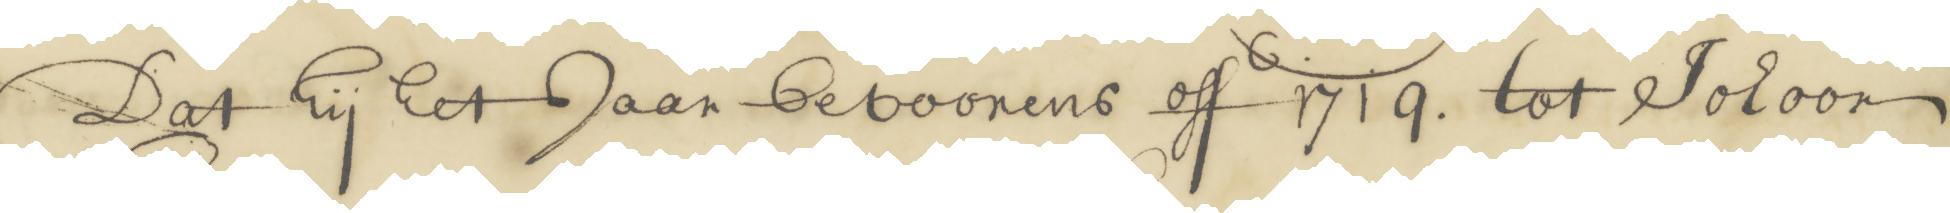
Dat hij het Jaar bevoorens off=' 1714. tot Iohoor
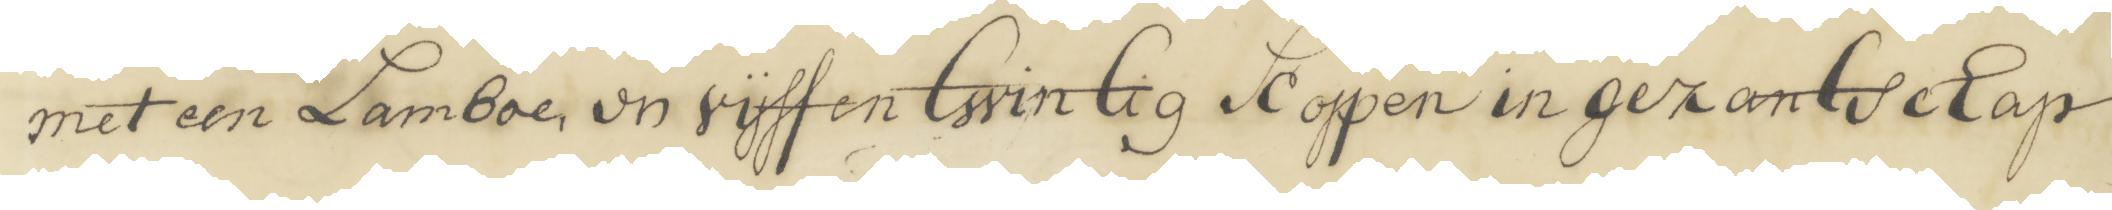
met een Lamboe, en vijffen twintig koppen in gezantschap
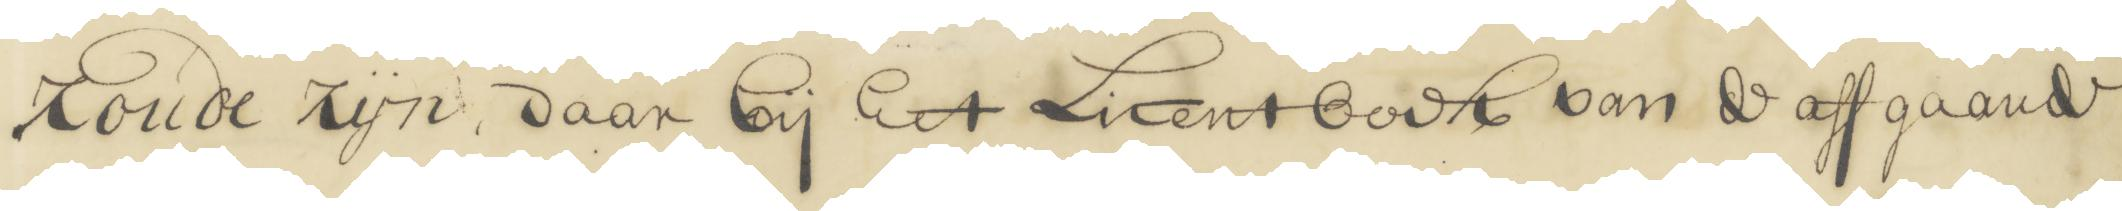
zoude zijn, daar bij het licentboek van de affgaande
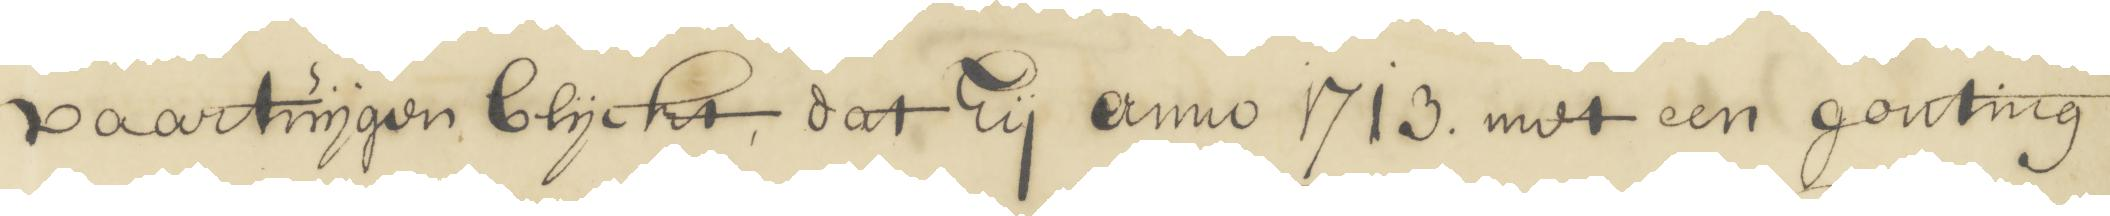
vaartuijgen blijckt, dat hij anno 1713. met een gonting
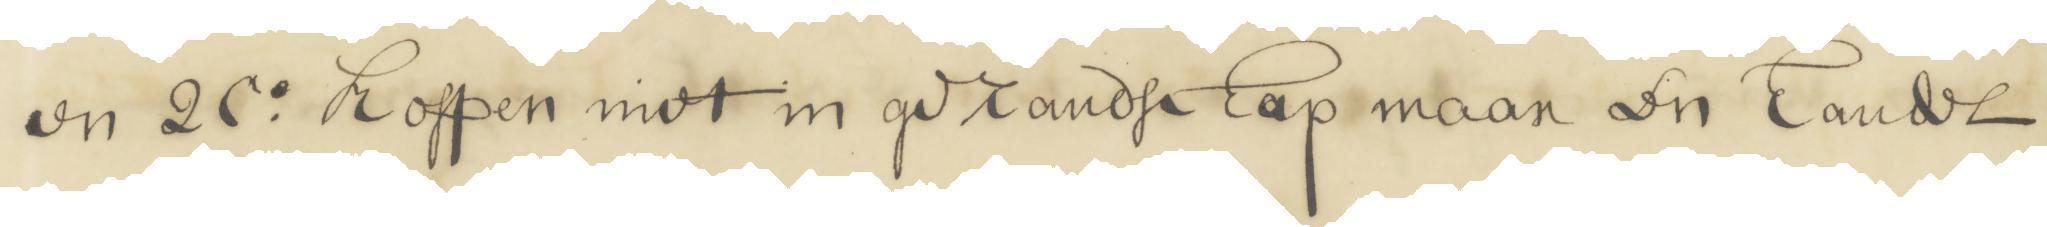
en 25: koppen niet in gezandschap maar ten handel
